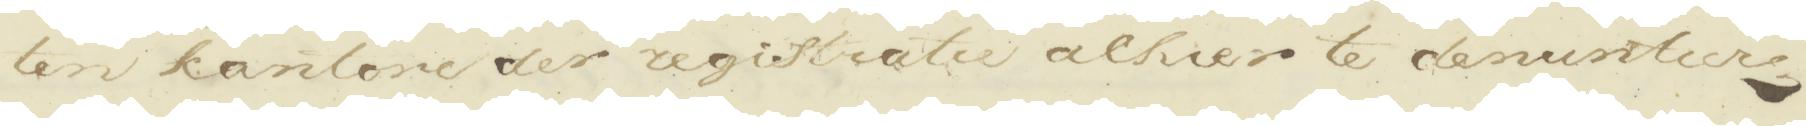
ten kantore der registratie alhier te denuntieren
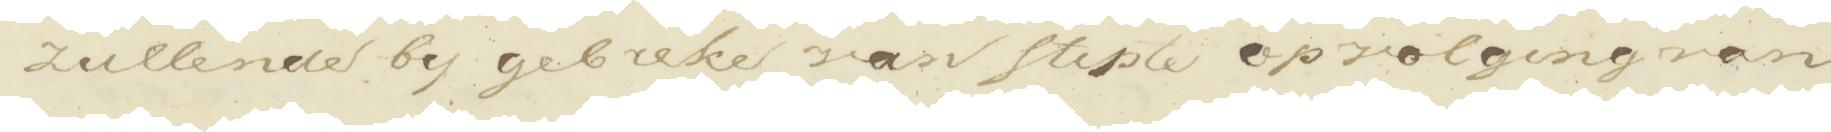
zullende by gebreke van stipte opvolging van
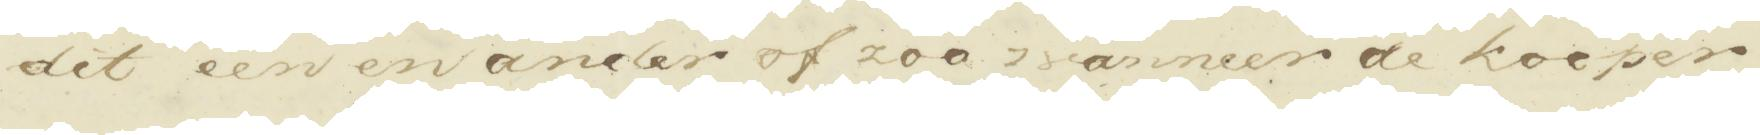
dit een en ander of zoo wanneer de kooper
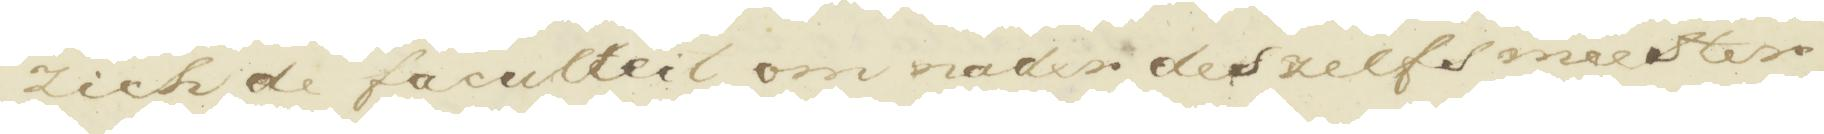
zich de faculteit om nader deszelfs meester
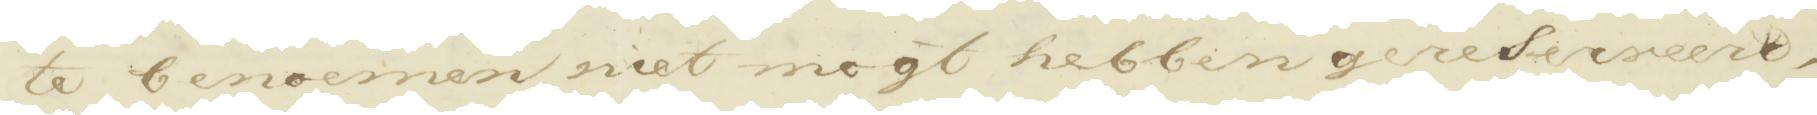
te benoemen niet mogt hebben gereserveerd,
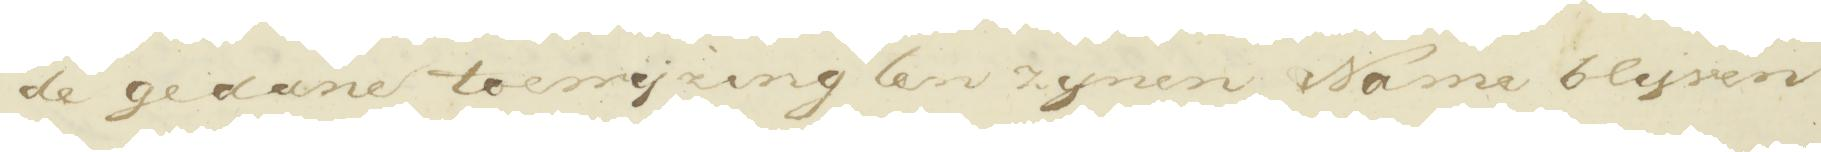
de gedane toewijzing ten zynen Name blyven
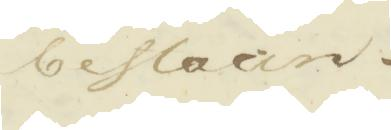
bestaan
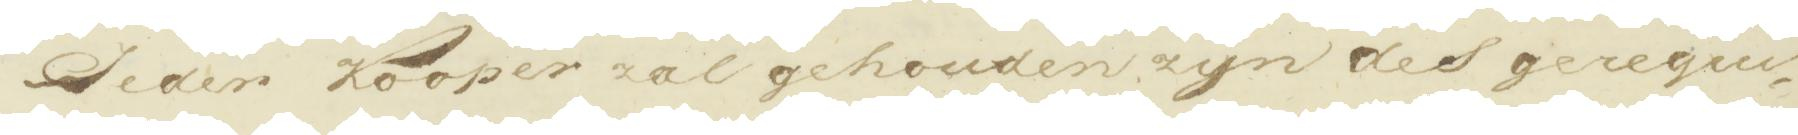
Ieder Kooper zal gehouden zijn des gerequi,
